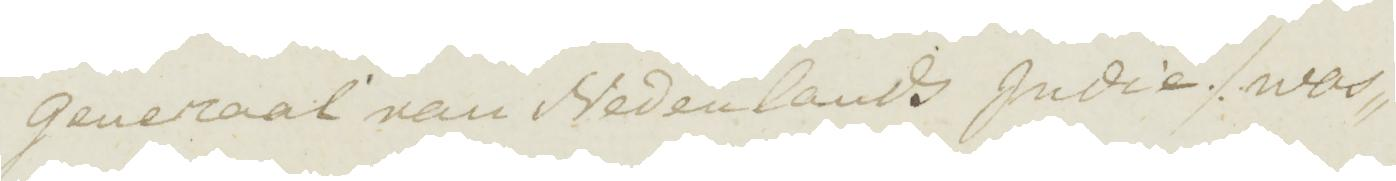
generaal van Nederlands jndie /:was„
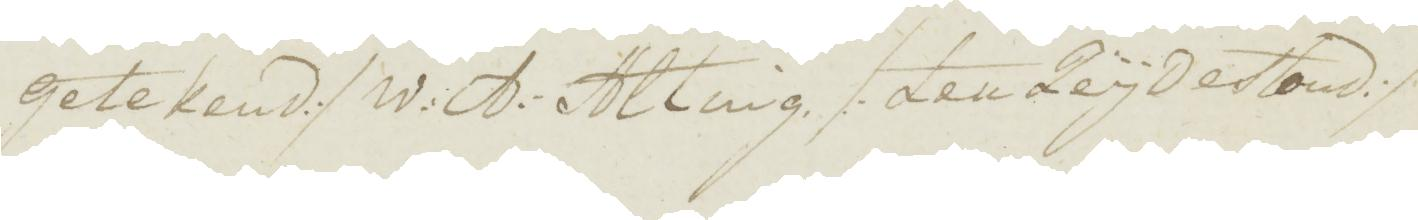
getekend:/ W: A: Alting /:ter Zeijde stond :/
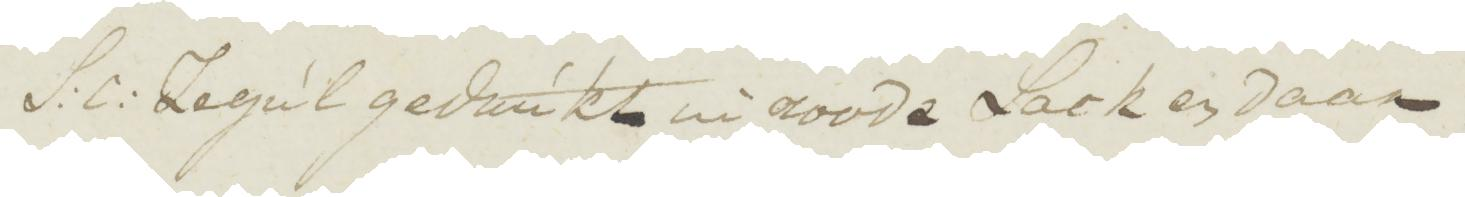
S:C: Zegul gedrukt in roode Lack en daar
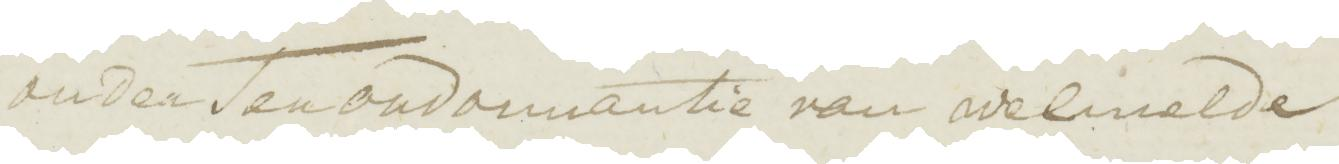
onder Ter ordonnantie van welmelde
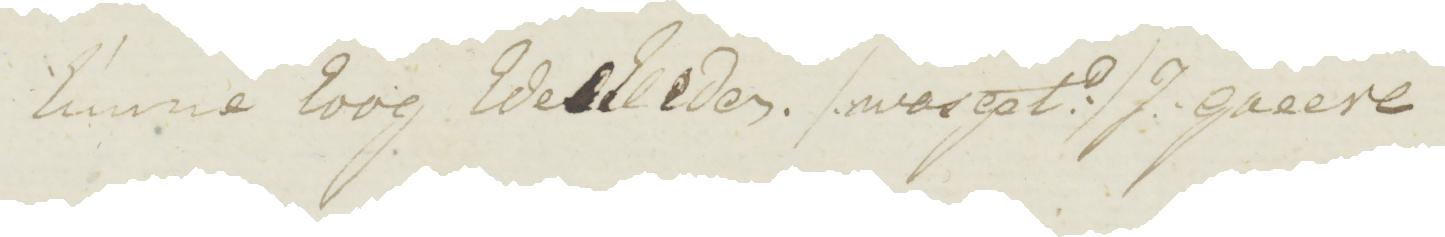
hunne hoog Edelheeden. /: was get:d:/ J: greeve
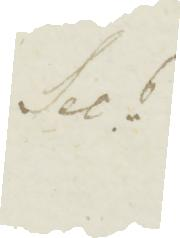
sec:s
